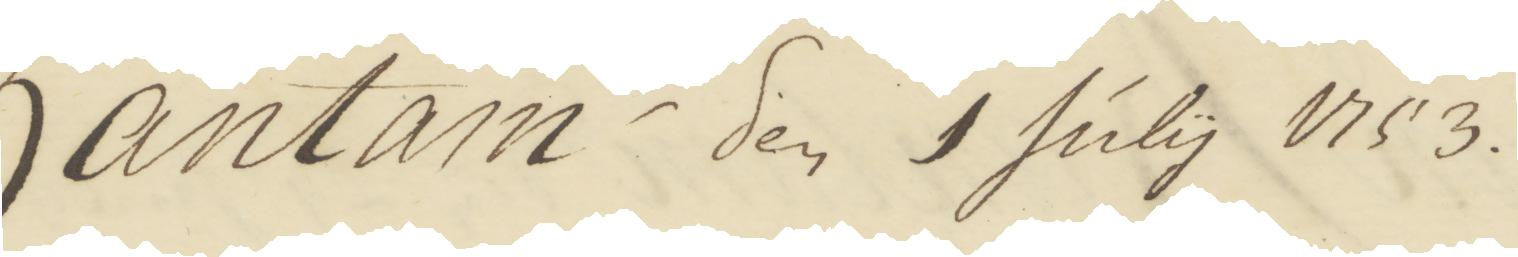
Van Bantam den 1 Julij 1753.
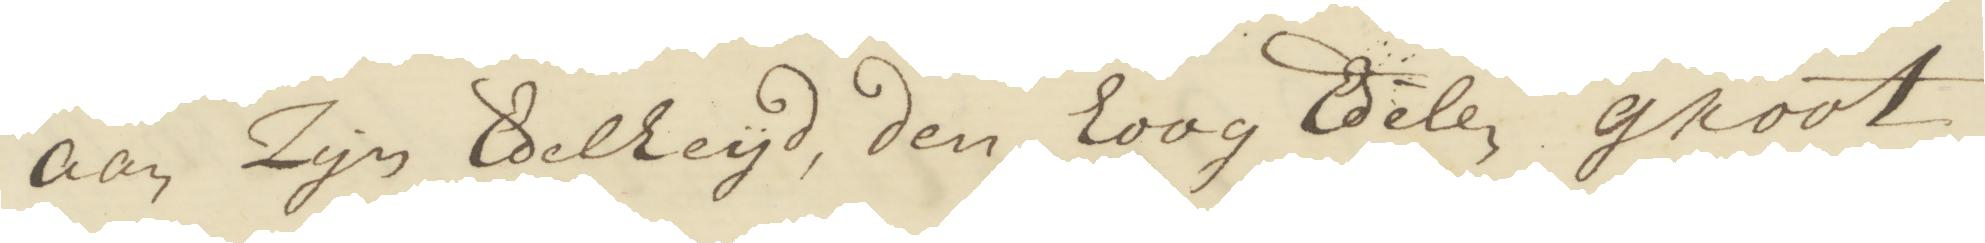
aan zijn Edelheijd, den hoog Edelen groot
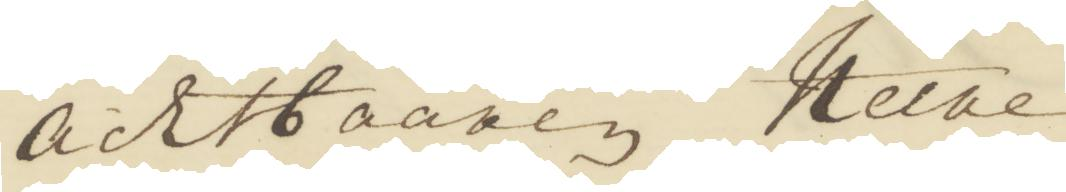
achtbaaren Heere
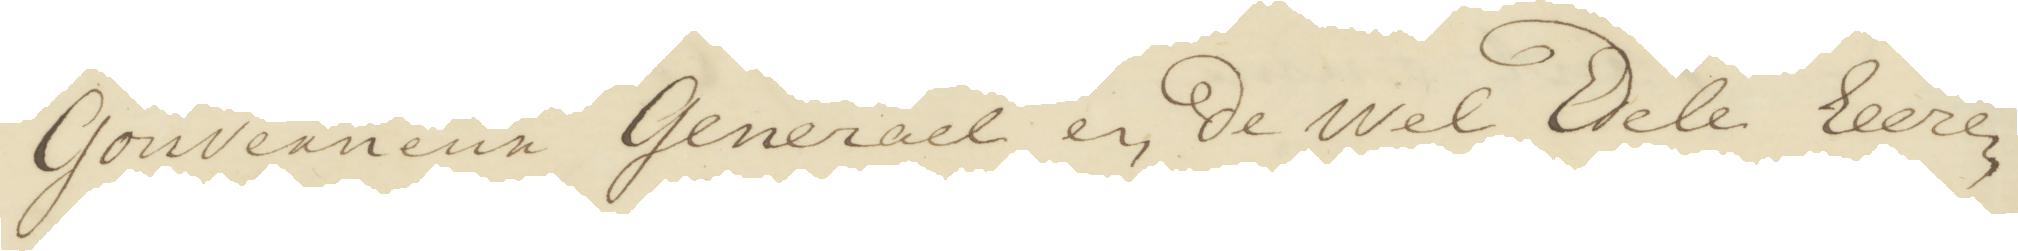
gouverneur generael en de wel Edele heeren
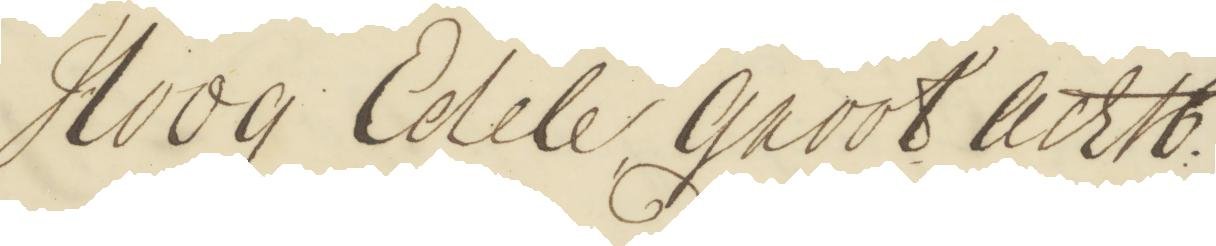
Hoog Edele, groot achtb.
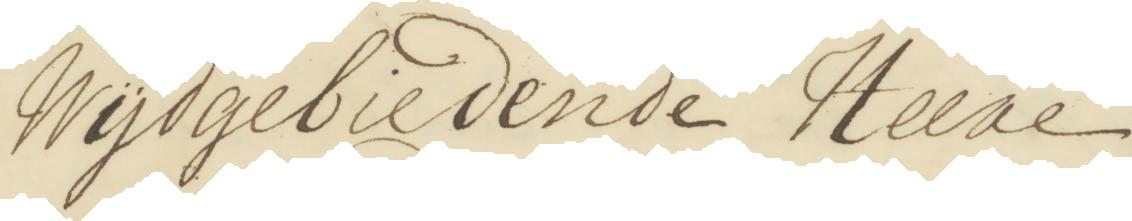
wijdgebiedende Heere
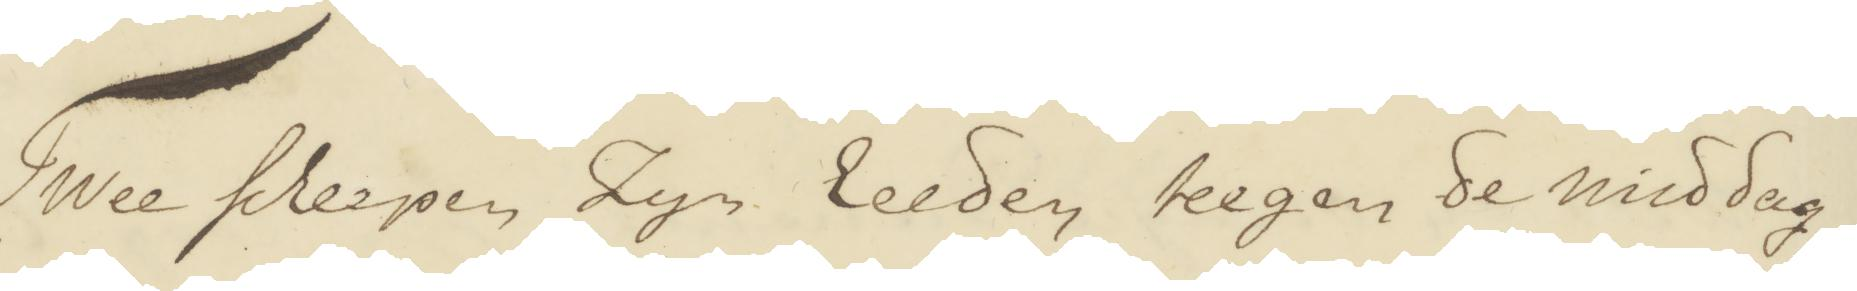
Twee scheepen zyn heeden teegen de middag
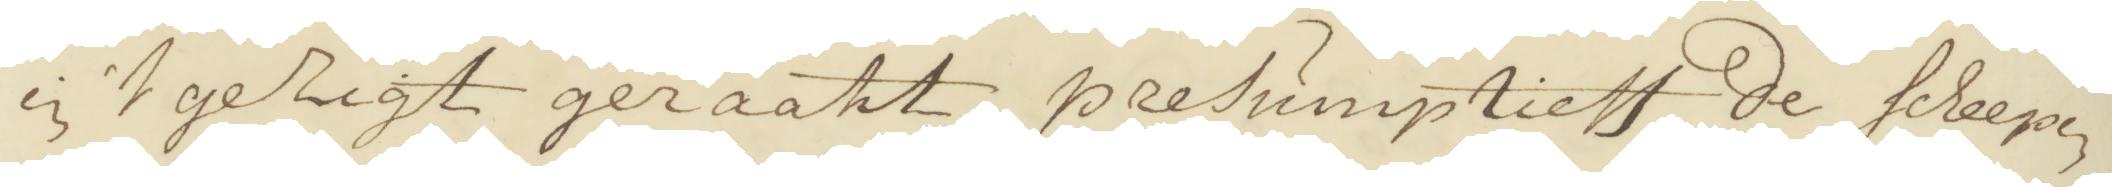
in ’t gezigt geraakt, presumptieff de scheepen
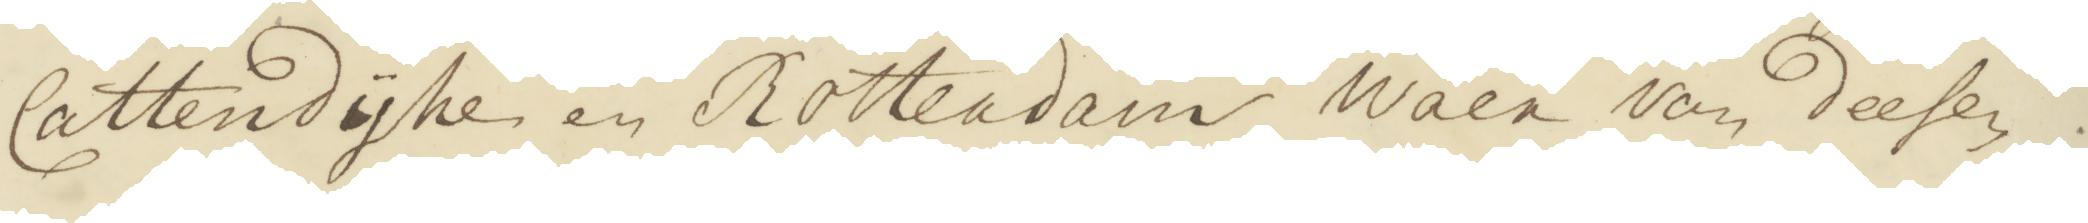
Cattendijke en Rotterdam waer van deesen
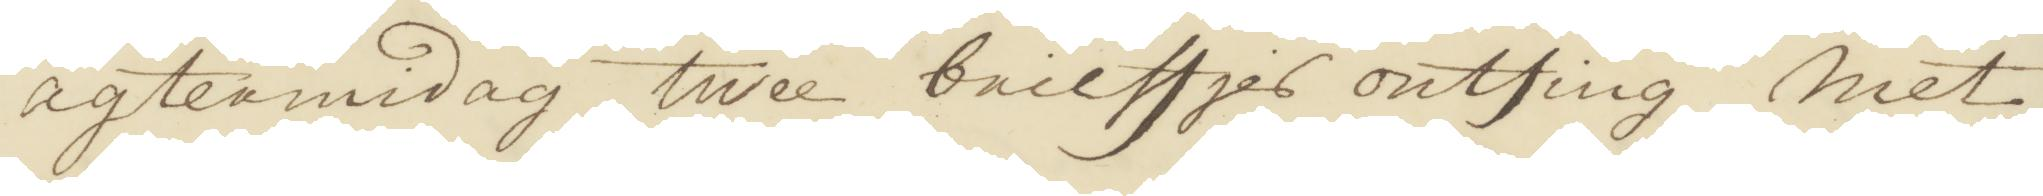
agtermidag twee brieffjes ontfing met
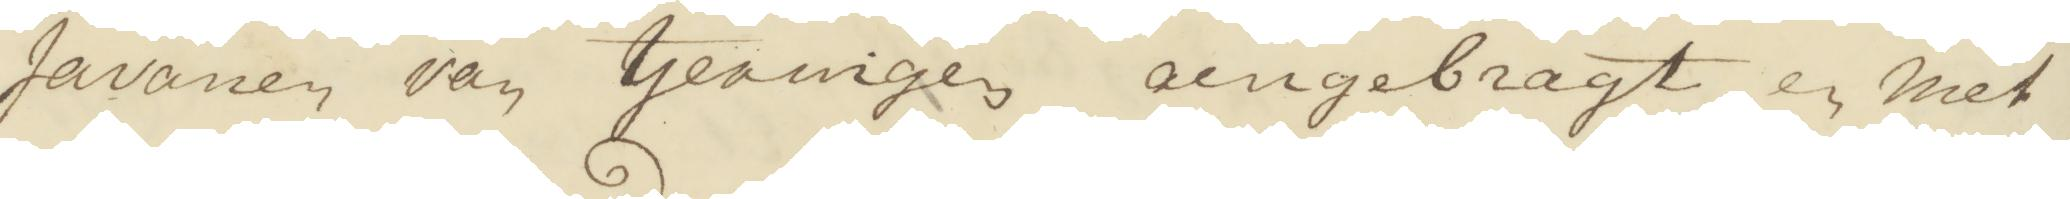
Javanen van tjernigen aengebragt en met
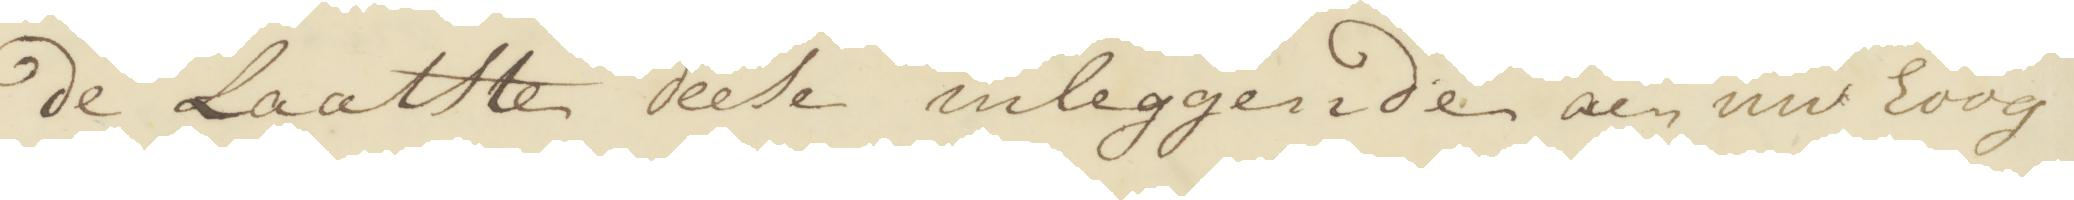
de laatste deese inleggende aen uw hoog
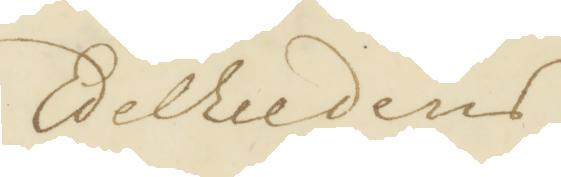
Edelheedens
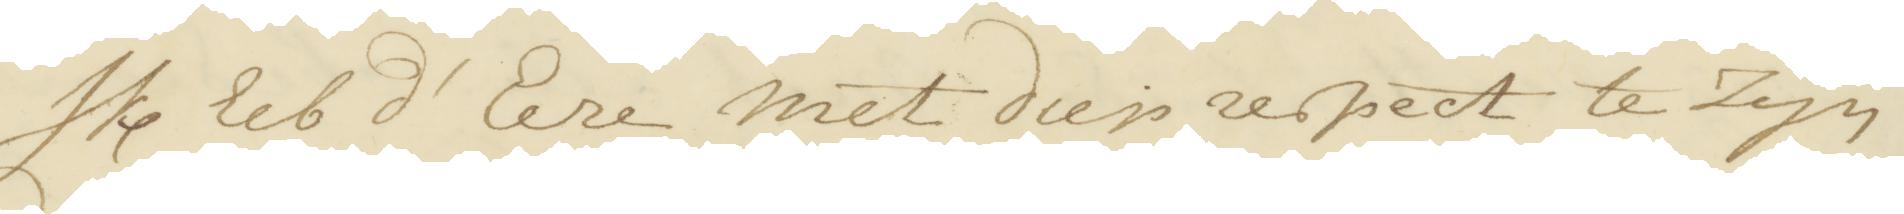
Jk heb d’ Eere met diep respect te zyn
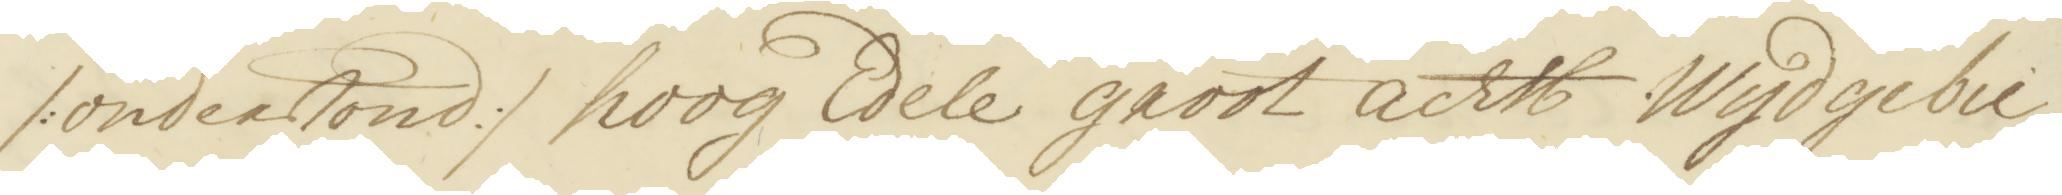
/:onderstond:/ hoog Edele groot achtb wydgebie
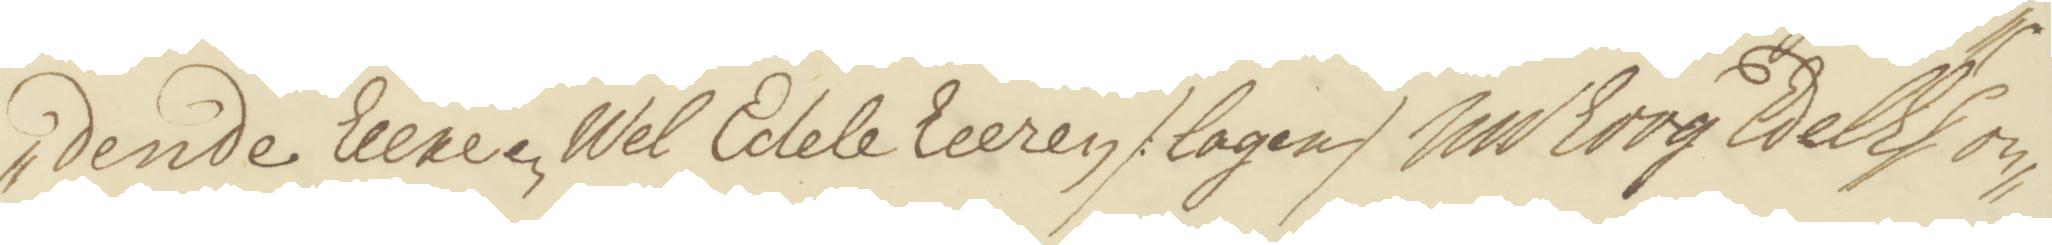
„dende heere en wel Edele heeren /:lager/ uw hoog Edelh„s on„
